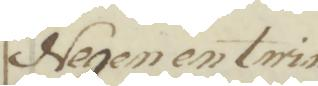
Negen en twin
